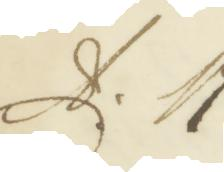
A. 1
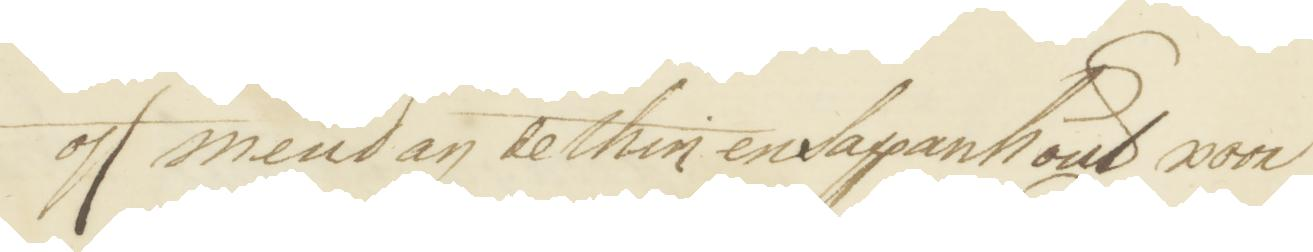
off men dan de thin en sappanhout voor
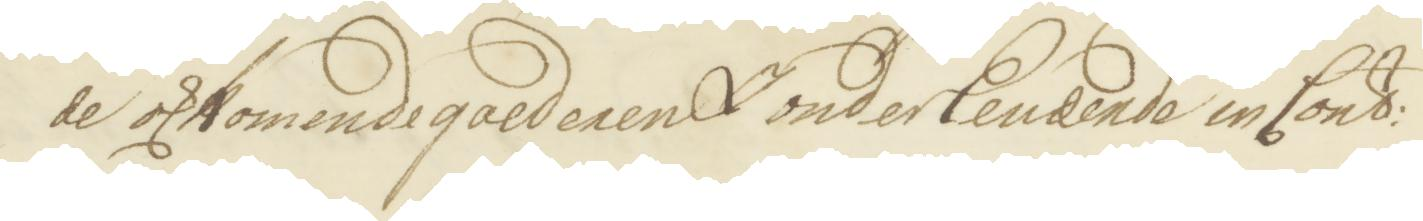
de overkomende goederen zonder Eenderde in Cond:t
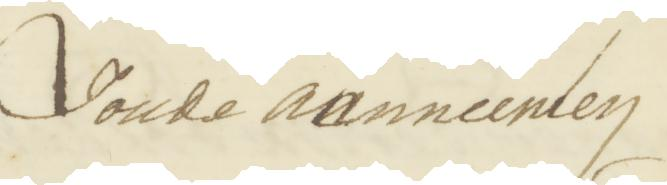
Zoude aanneenten
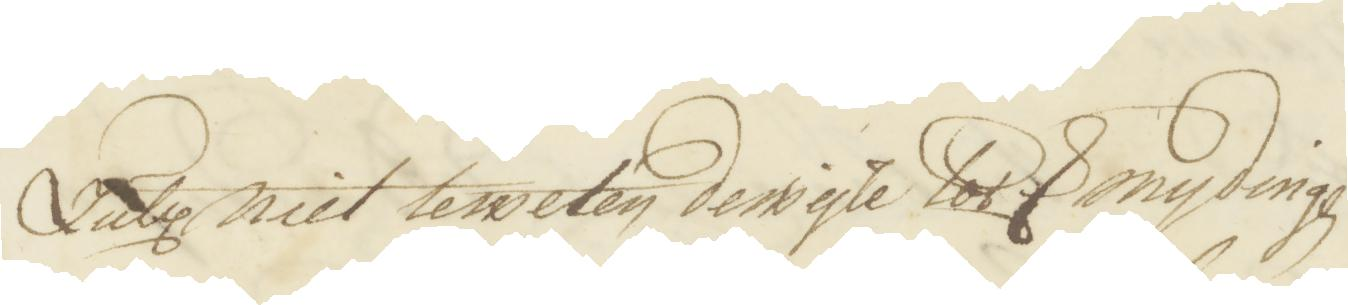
Zulx niet te weten dewijle tot vermyding
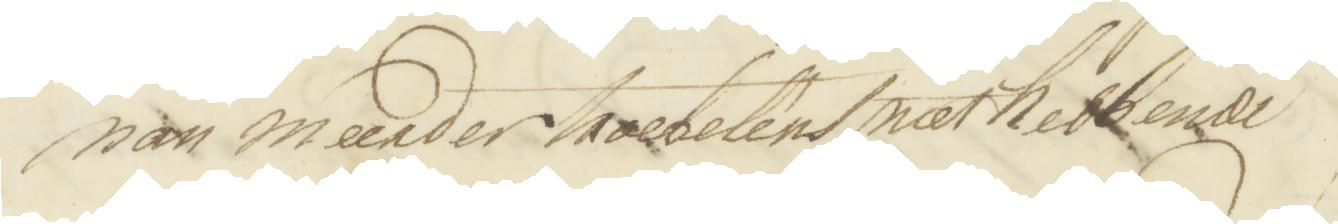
van meerder troebelens niet hebbende
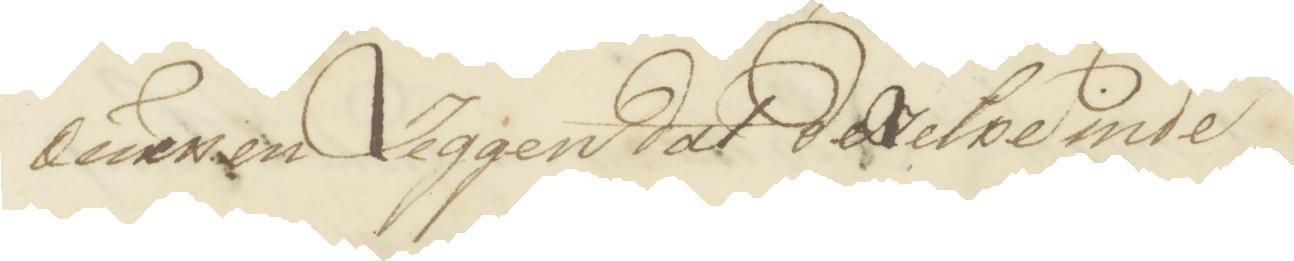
durven Zeggen dat dezelve in de
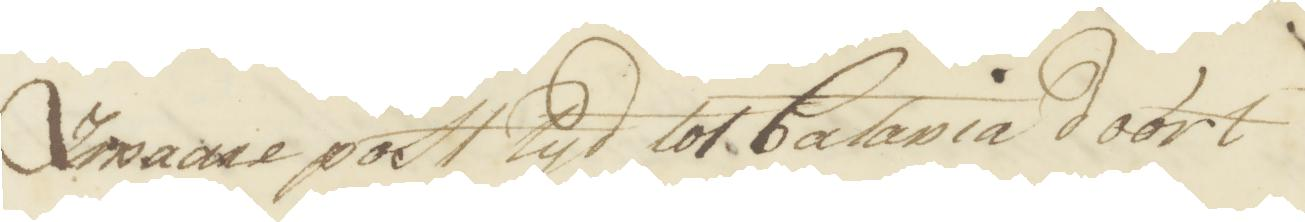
zwaare post tyd tot batavia door 't
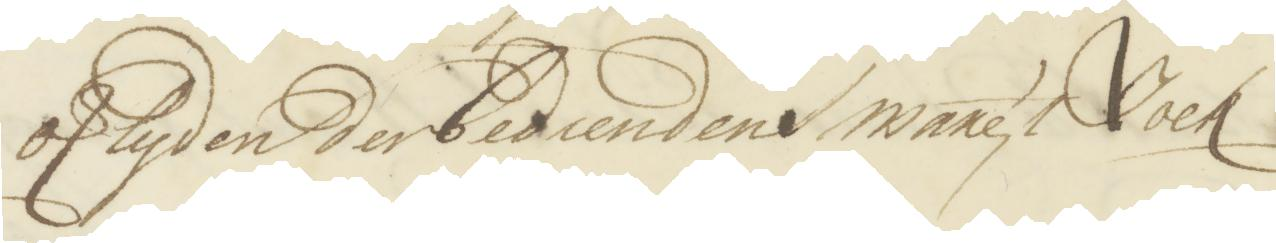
overlyden der bediendens waren 't Zoek
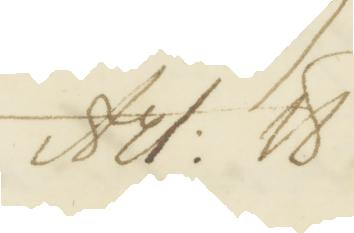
Art: 18
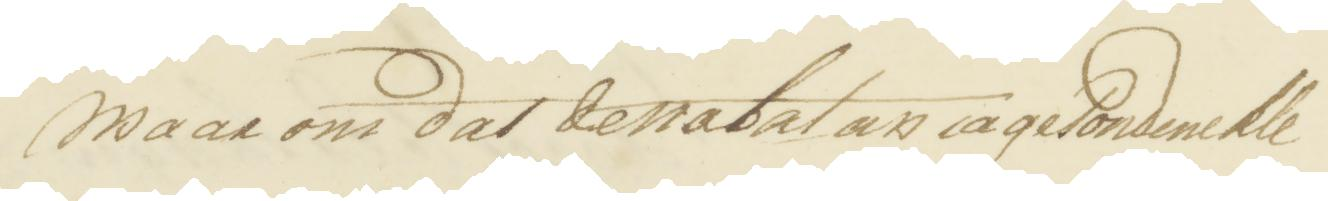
waarom dat de na batavia gesondene kle
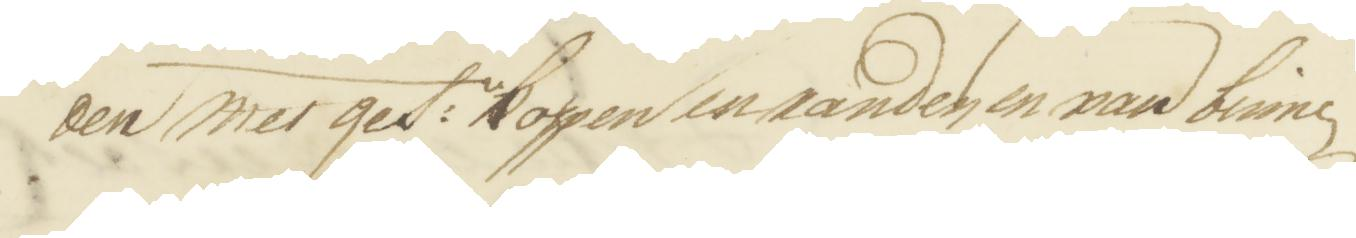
den met ges:e koppen en randen en van binnen
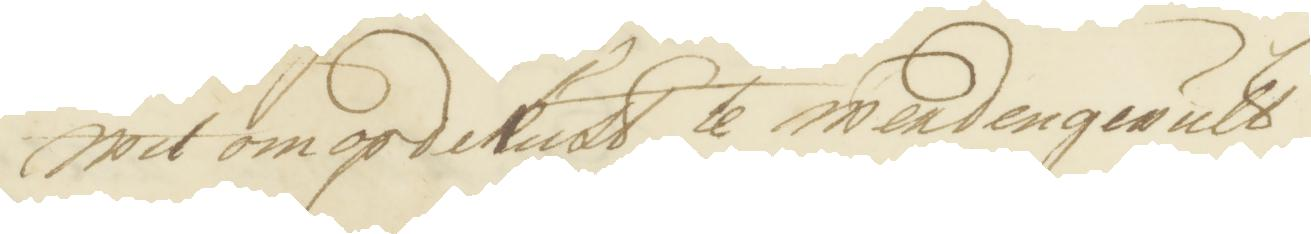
met om op de kust te werden gevult
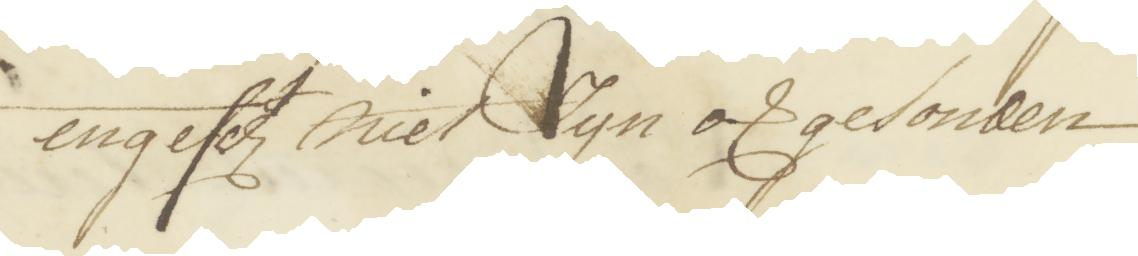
en gescht niet Zyn overgesonden
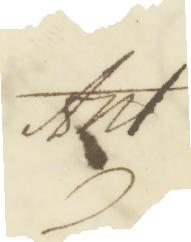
Ant
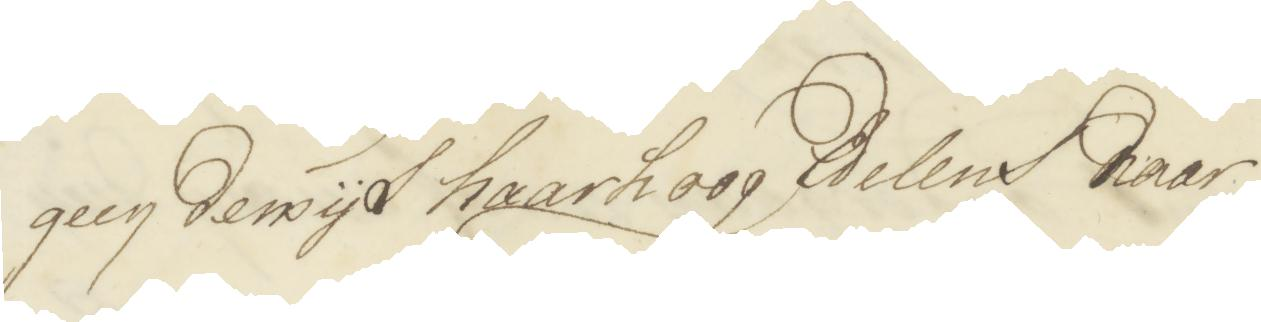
geen dewijs haar hoog Edelens daar
